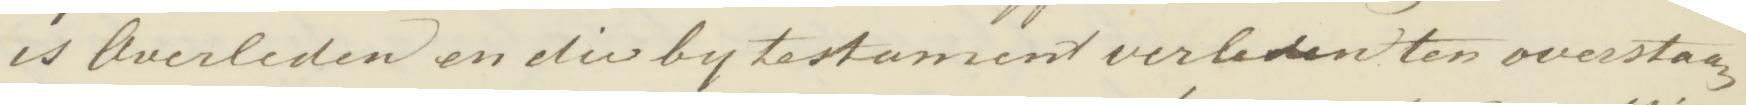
is overleden en die by testament verleden ten overstaan
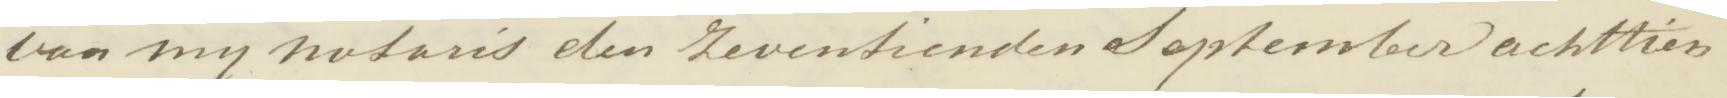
van my notaris den zeventienden September achttien
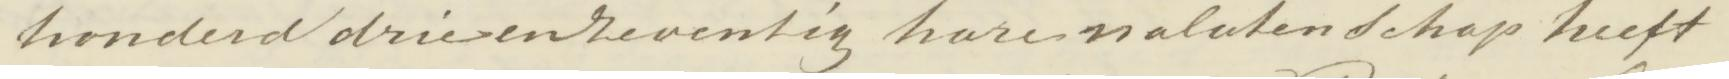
honderd drie en zeventig hare nalatenschap heeft
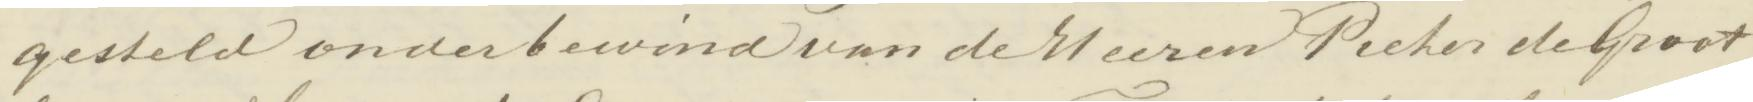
gesteld onder bewind van de Heeren Pieter de Groot
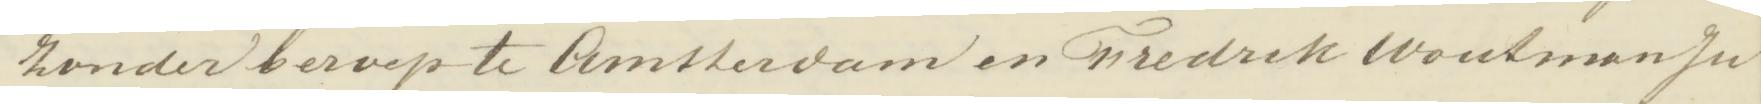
zonder beroep te Amsterdam en Fredrik Woutman Ju
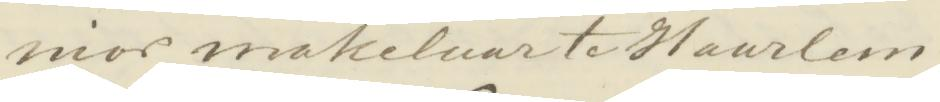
nior makelaar te Haarlem
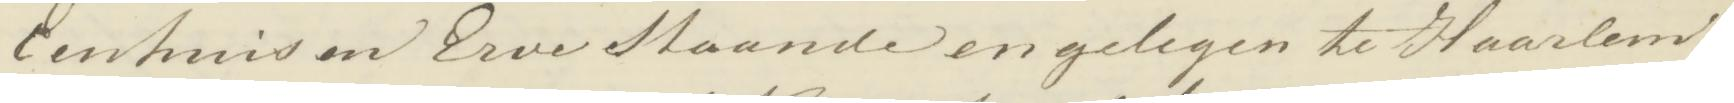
Een huis en Erve staande en gelegen te Haarlem
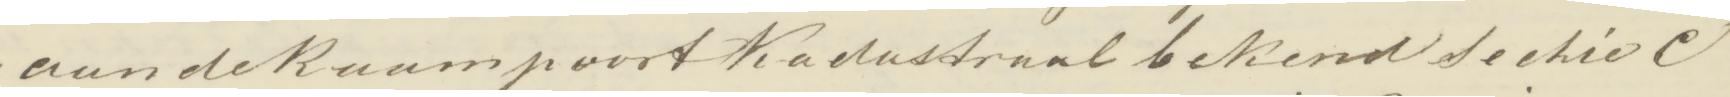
aan de Raampoort Kadastraal bekend sectie C
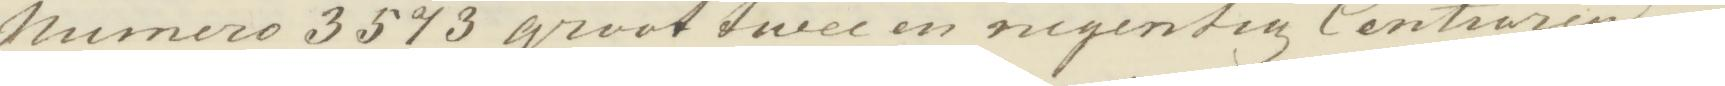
Numero 3573 groot twee en negentig Centiaren en
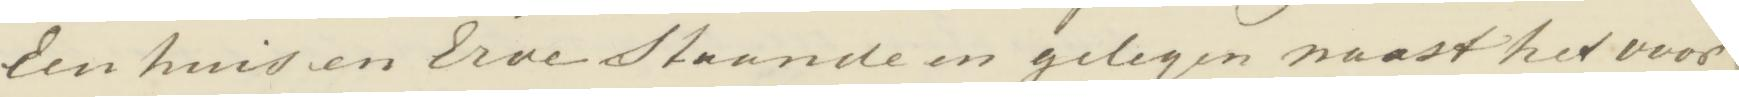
Een huis en Erve staande en gelegen naast het voor
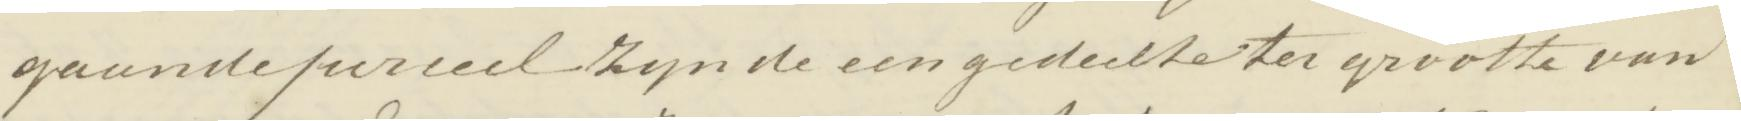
gaande perceel zynde een gedeelte ter grootte van
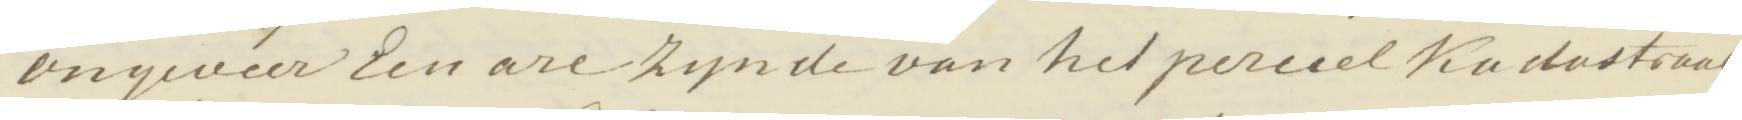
ongeveer Een are zynde van het perceel Kadastraal
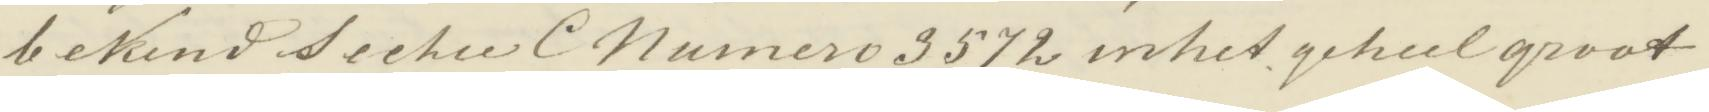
bekend sectie C Numero 3572 in het geheel groot
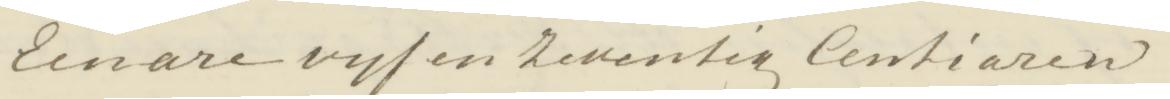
Een are vyf en zeventig Centiaren
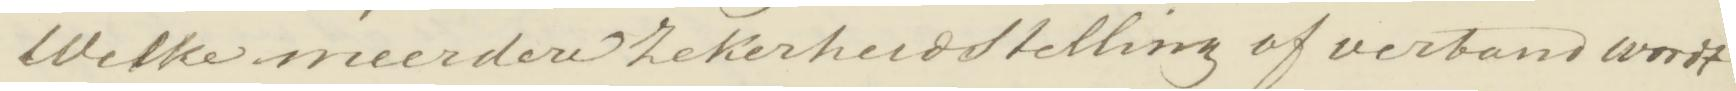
Welke meerdere zekerheidstelling of verband wordt
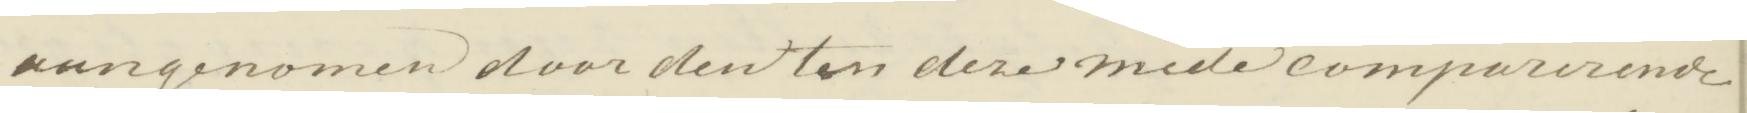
aangenomen door den ten deze mede comparerende
